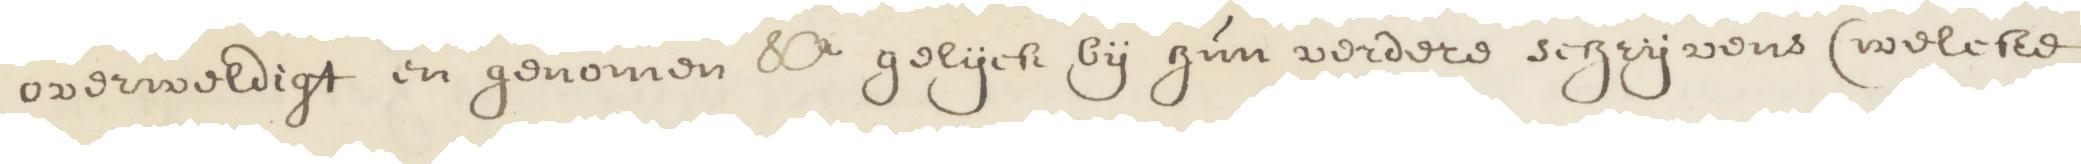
overweldigt en genomen &Ca gelijck bij hun verdere schrijvens (welcke
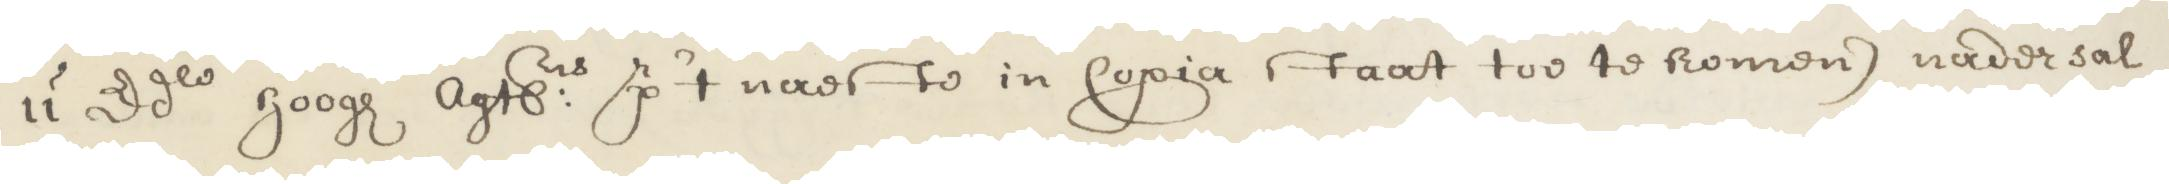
u Edle hoogh Agtb:en pr ’t naeste in Copia staat toe te komen) nader sal
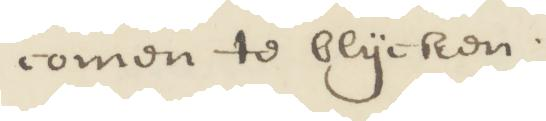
comen te blijcken.
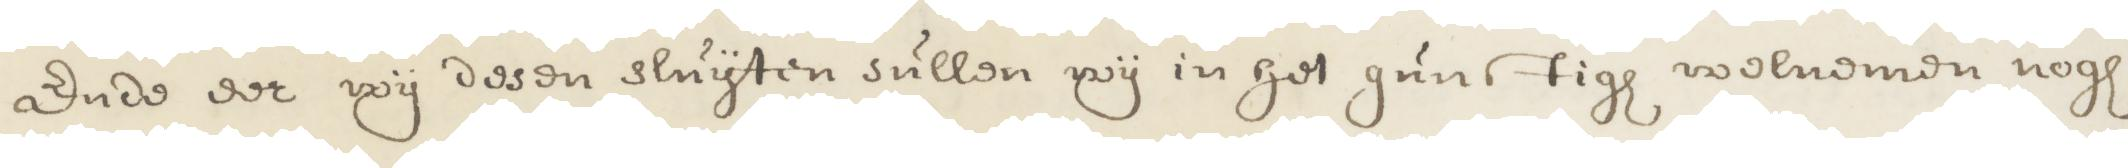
Ende eer wij desen sluijten sullen wij in het gunstigh welnemen nogh
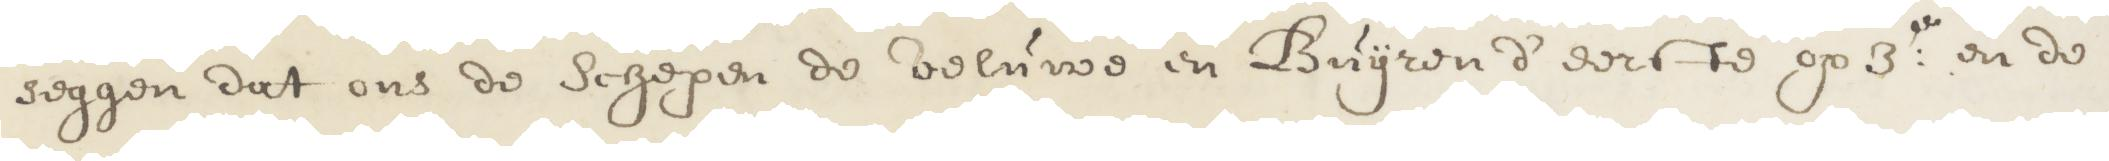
seggen dat ons de schepen de veluwe en Buijren d’ eerste op 3:e en de
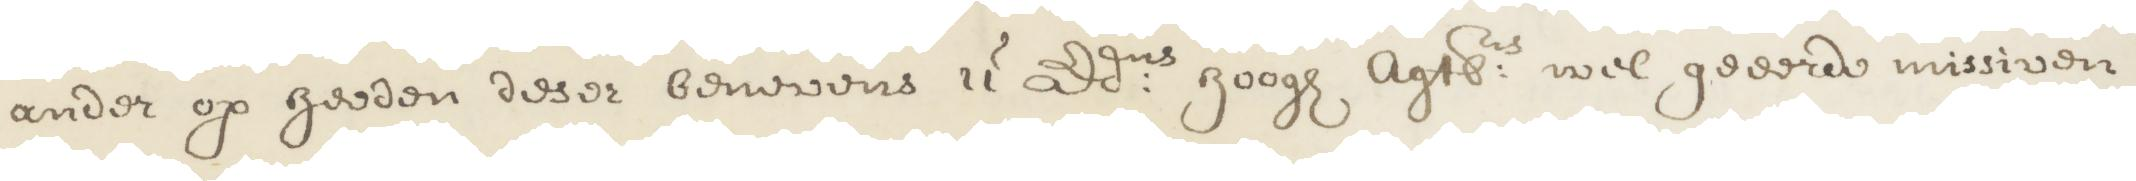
ander op heeden deser benevens u Ed:ns hoogh Agtb:ren wel geeerde missiven
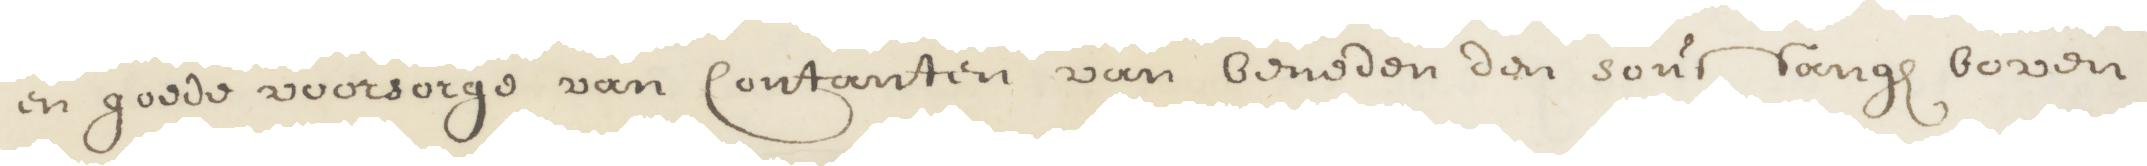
en goede voorsorge van Contanten van beneden den soussangh boven
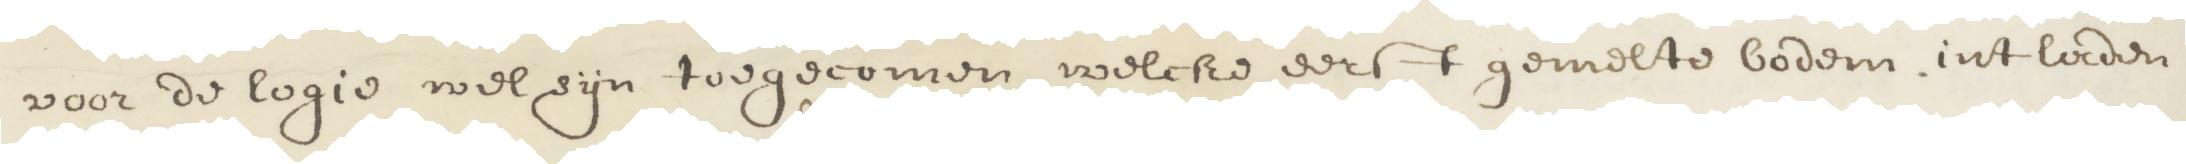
voor de logie wel sijn toegecomen welcke eerst gemelte bodem int laden
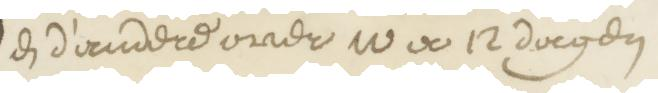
en d’andere over 10 a 12 dagen
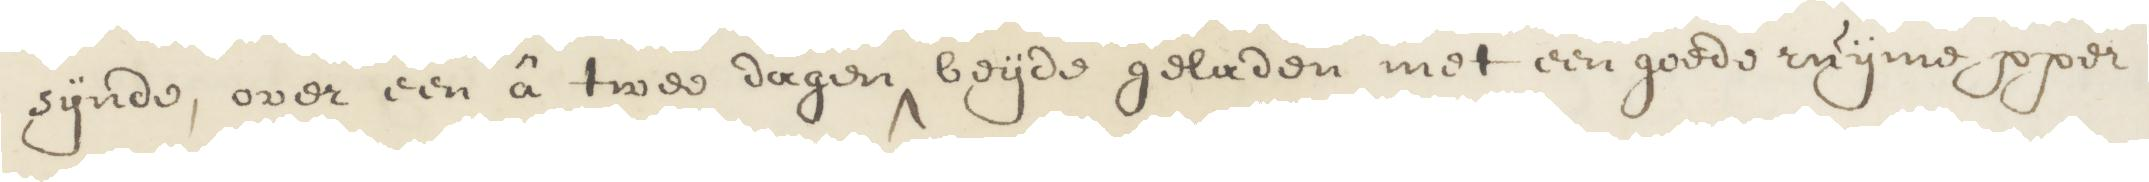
sijnde, over een â twee dagen ^ beijde geladen met een goede ruijme pper
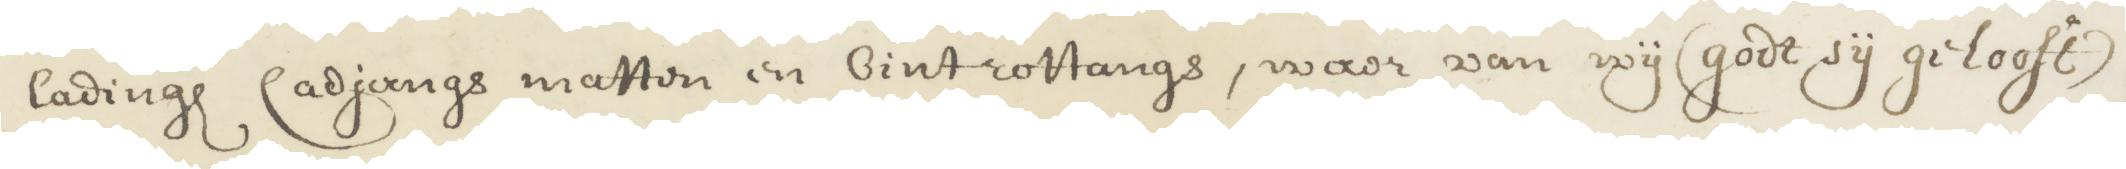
ladingh Cadjangs matten en bintrottangs, waer van wij (godt sij gelooft)
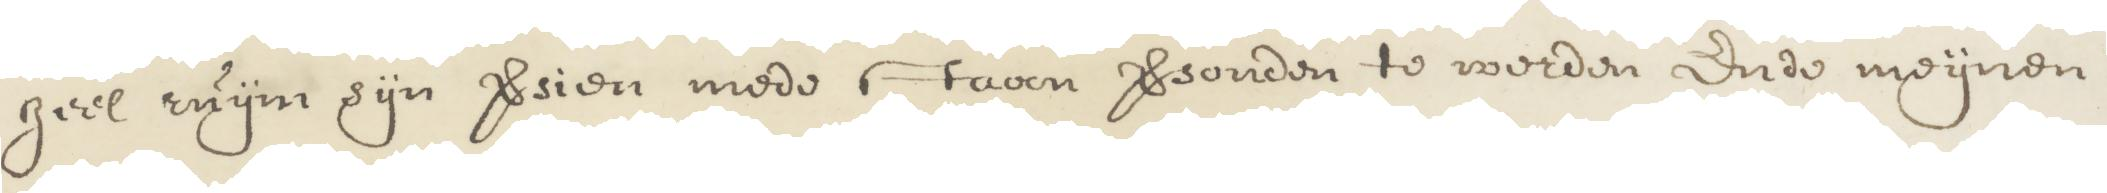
geel ruijm sijn versien mede staan versonden te werden Ende meijnen
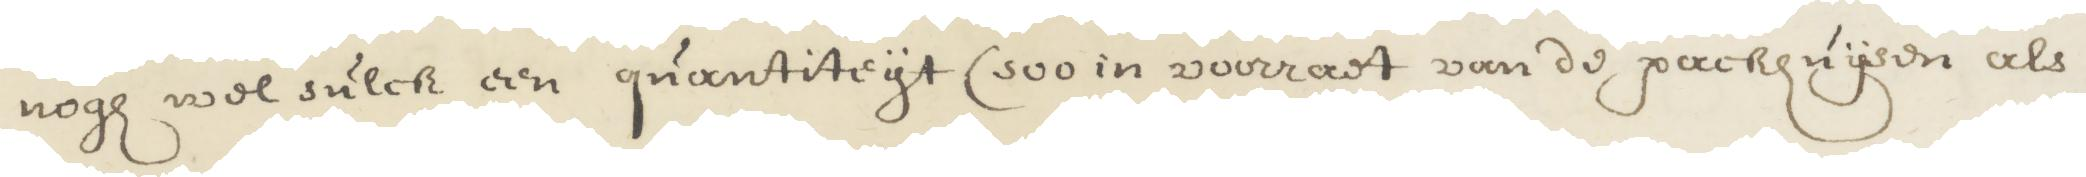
nogh wel sulck een quantiteijt (soo in voorraet van de packhuijsen als
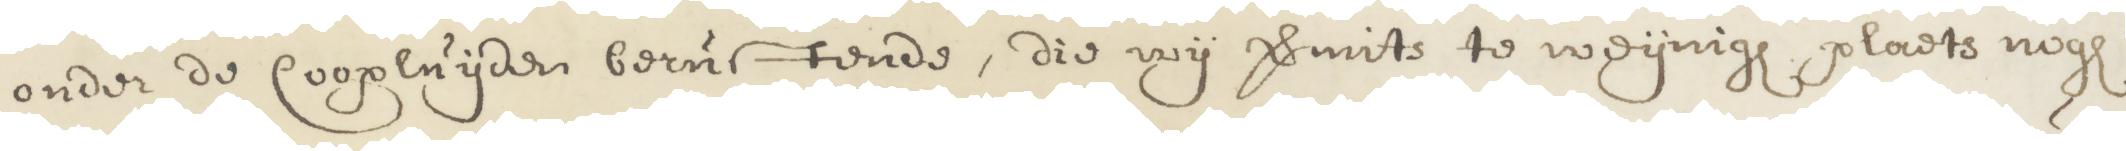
onder de Coopluijden berustende, die wij vermits te weijnigh plaets nogh
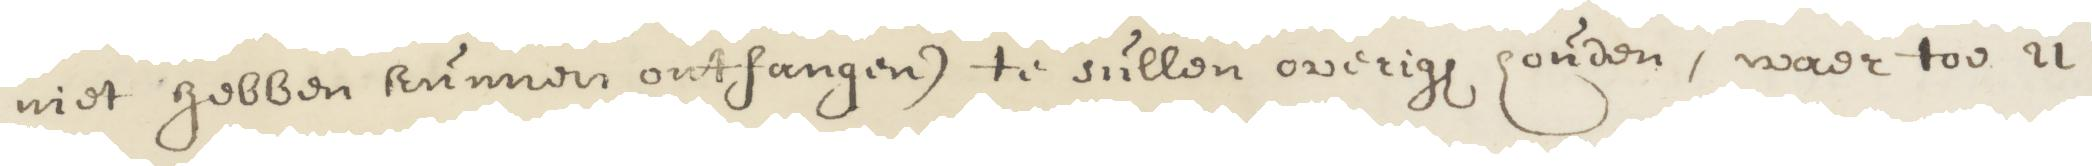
niet hebben kunnen ontfangen) te sullen overigh houden, waer toe u
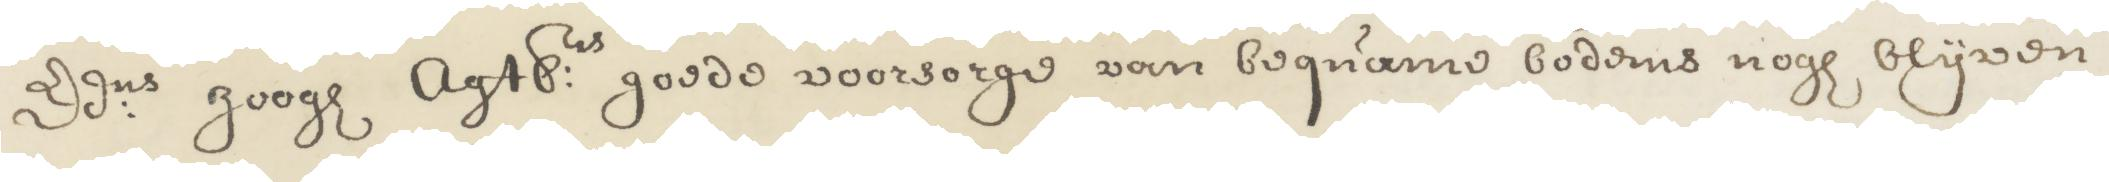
Ed:ns hoogh Agtb:en goede voorsorge van bequame bodems nogh blijven
